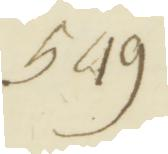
549
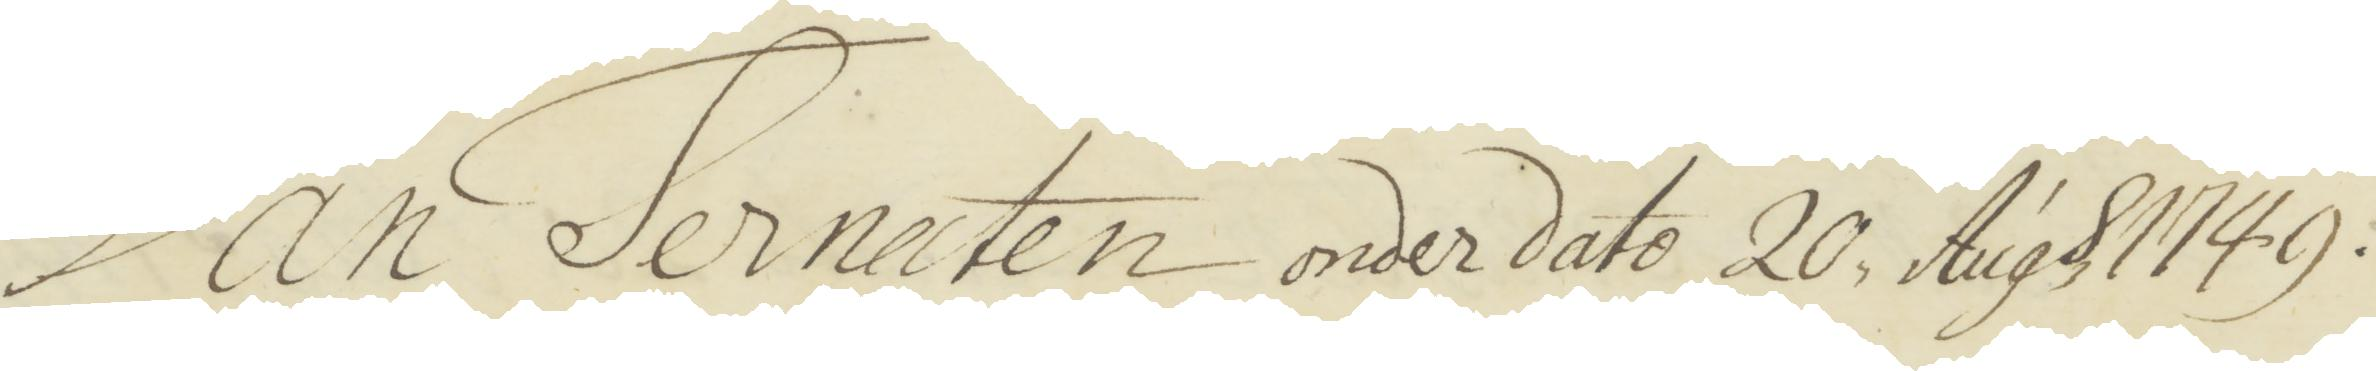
Van Ternaten onder dato 20„ Aug„s 1749
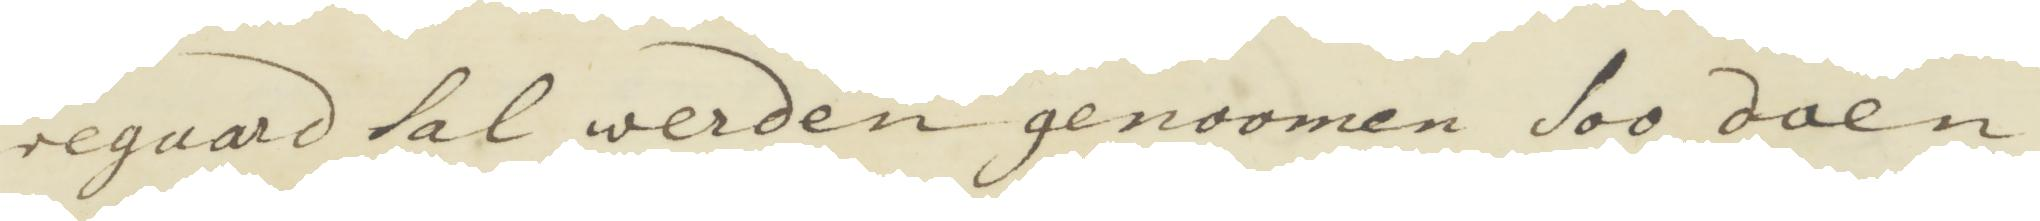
reguard sal werden genoomen soo doen
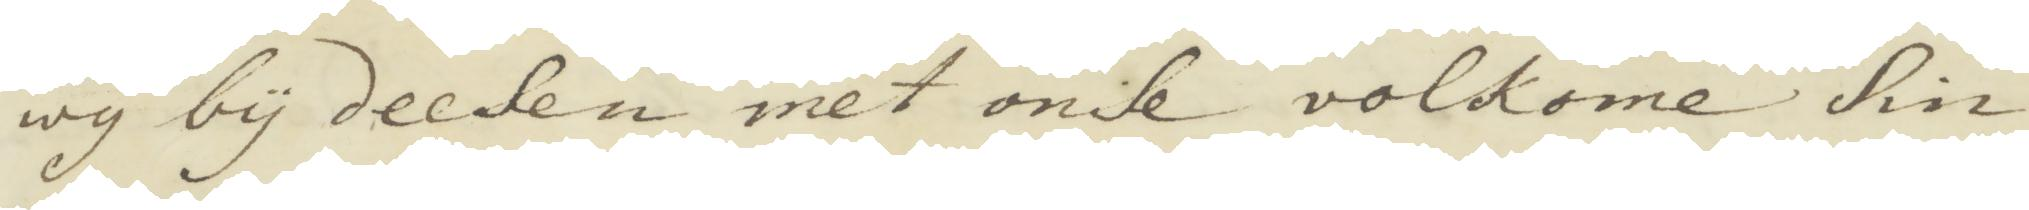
wij bij deesen met onse volkome sin
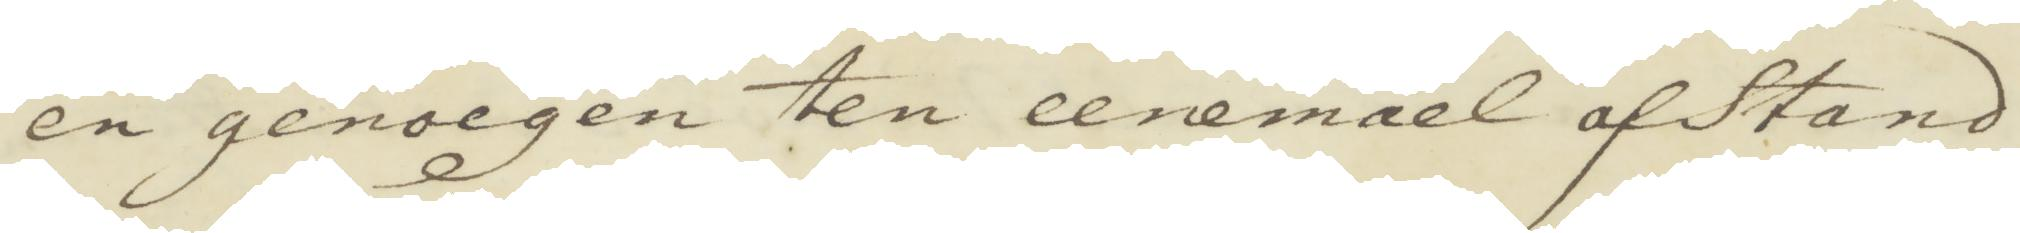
en genoegen ten eenemael afstand
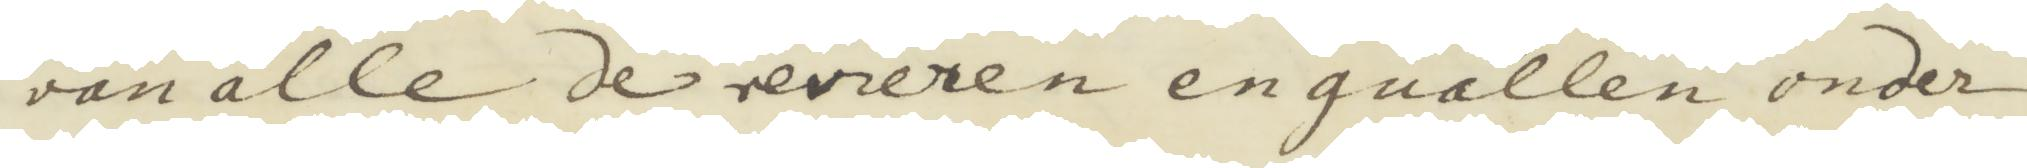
van alle de revieren en quallen onder
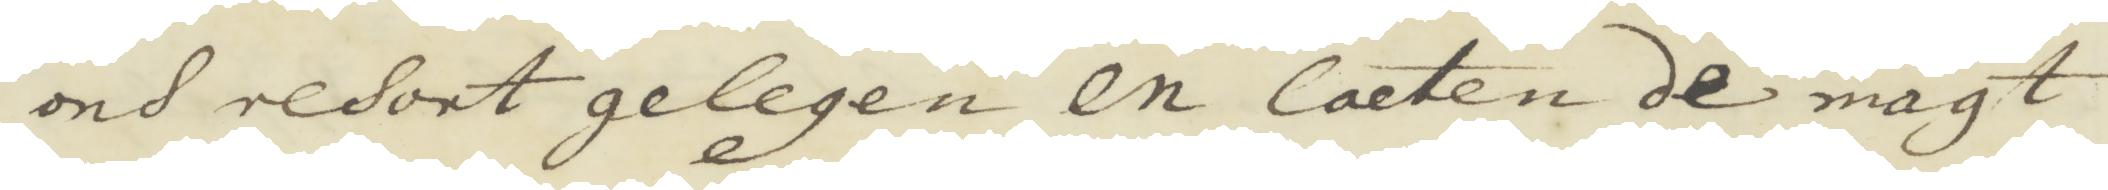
ons resort gelegen en laeten de magt
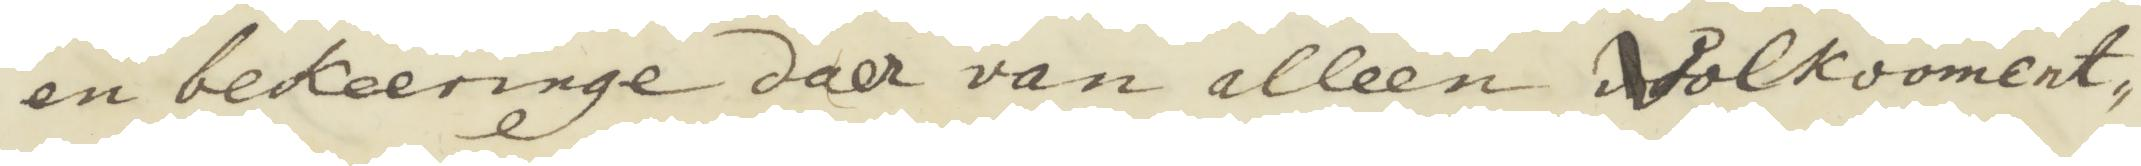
en bekeeringe daer van alleen volkooment„
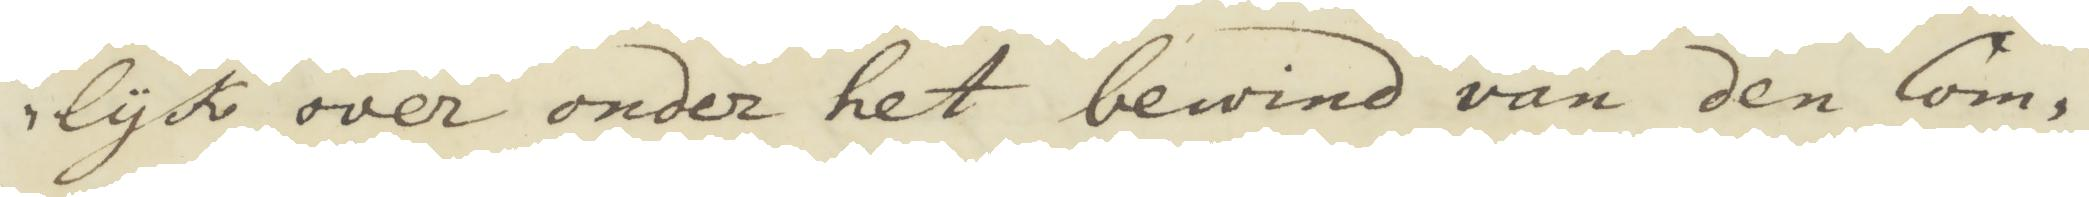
„lijk over onder het bewind van den Com„
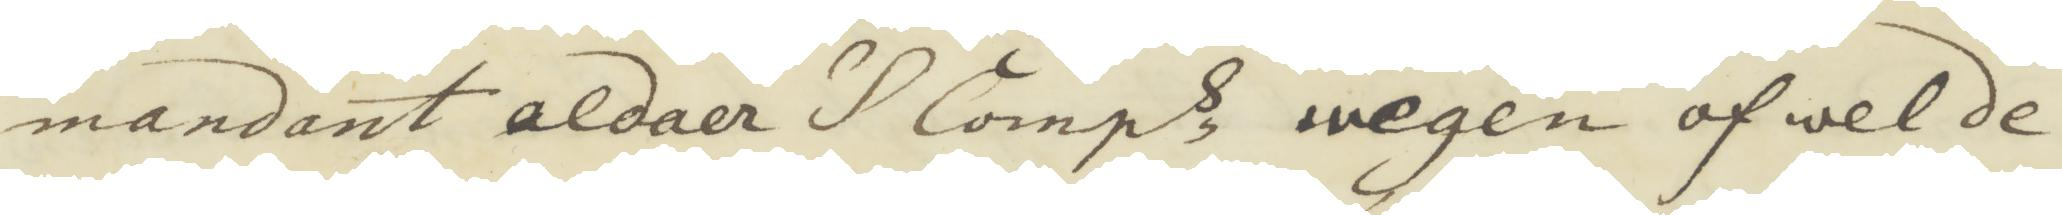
mandant aldaer ’S Comp„s wegen of wel de
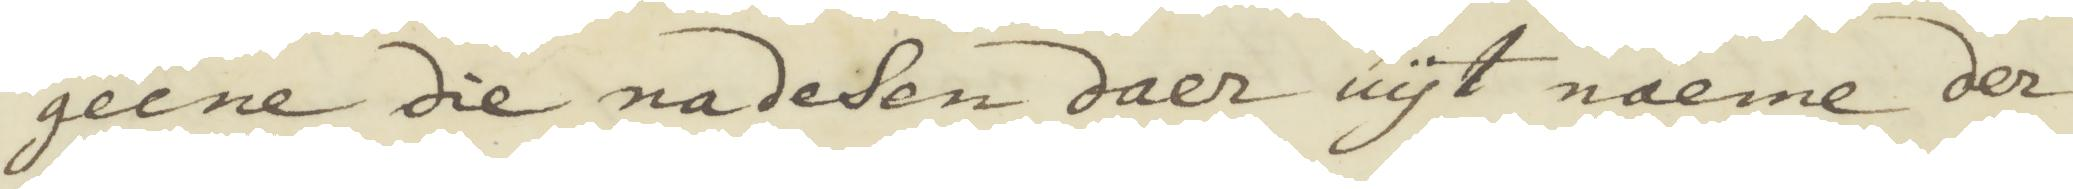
geene die nadesen daer uijt naeme der
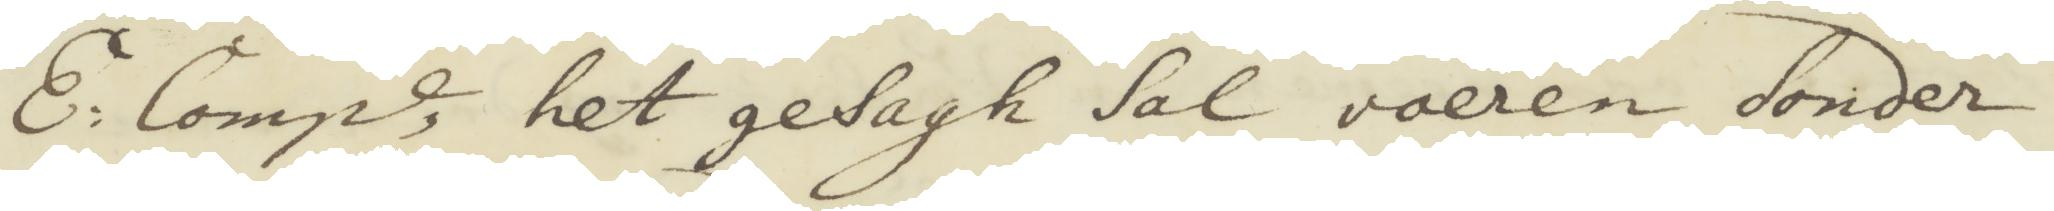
E: Comp„e het gesagh sal voeren sonder
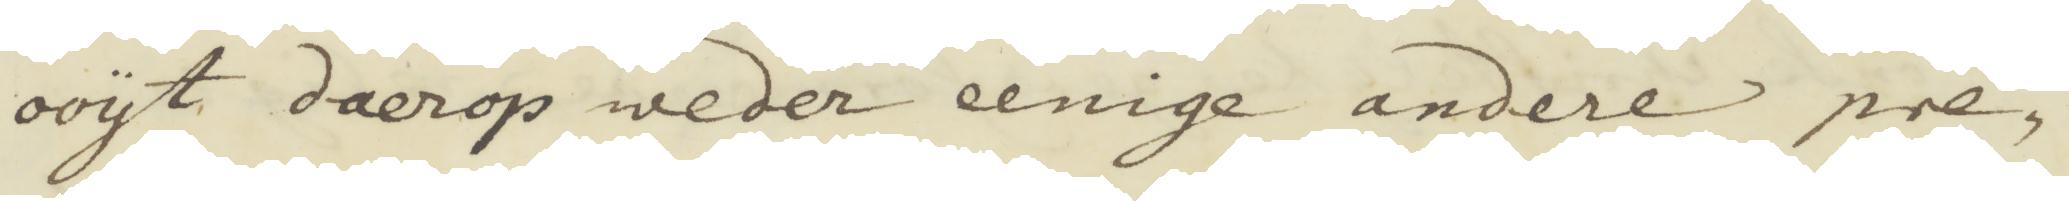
ooijt daerop weder eenige andere pre„
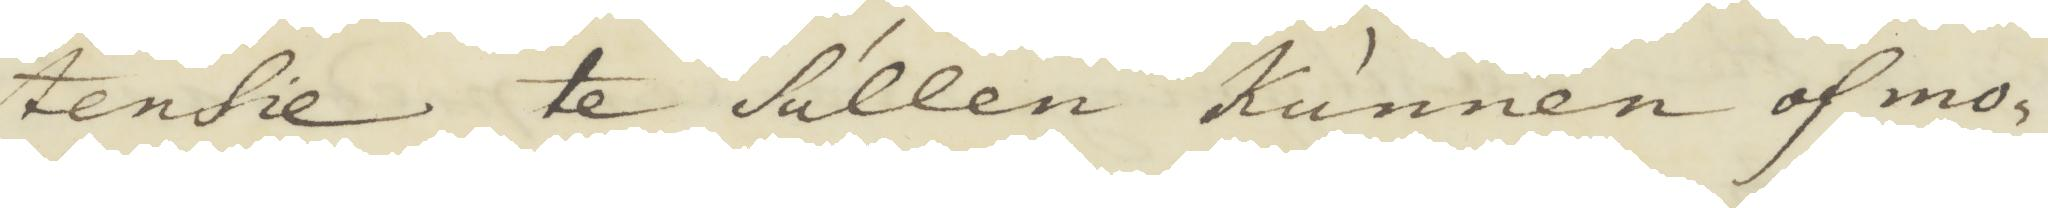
tensie te sullen kunnen of mo„
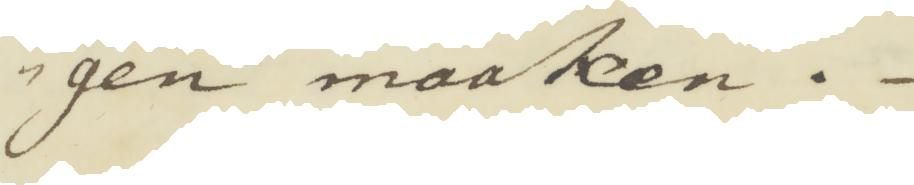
„gen maaken.
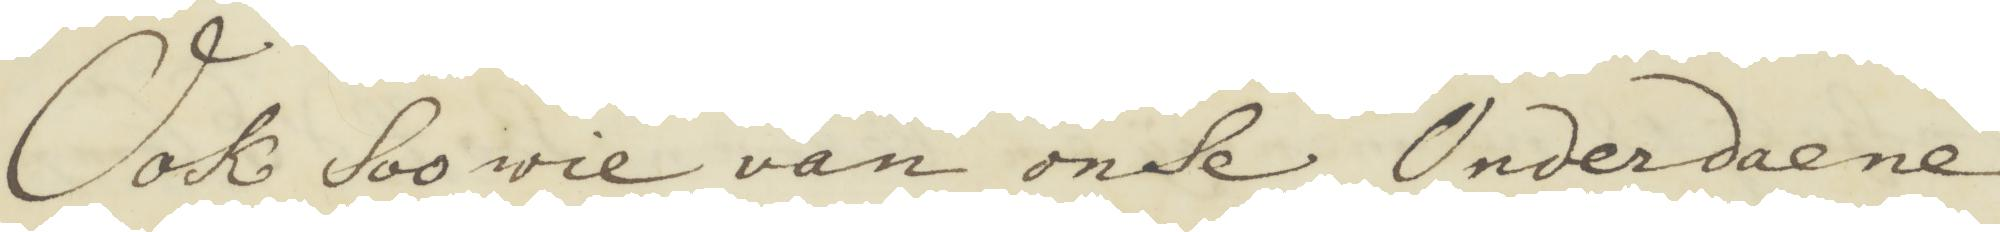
Ook soo wie van onse Onderdaene
